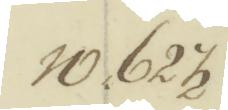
10„62½
